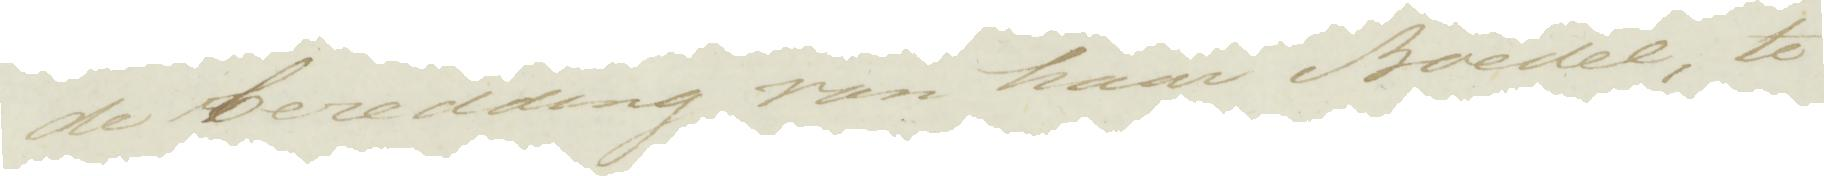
de beredding van haar Boedel, te
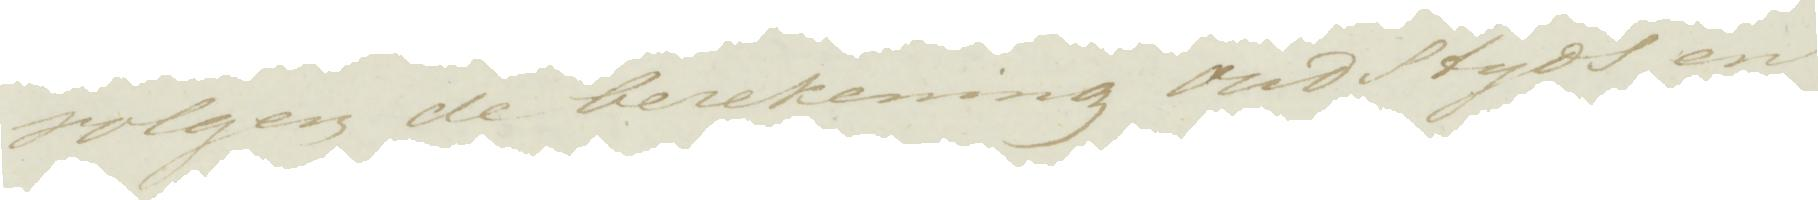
volgen de berekening oudstyds en
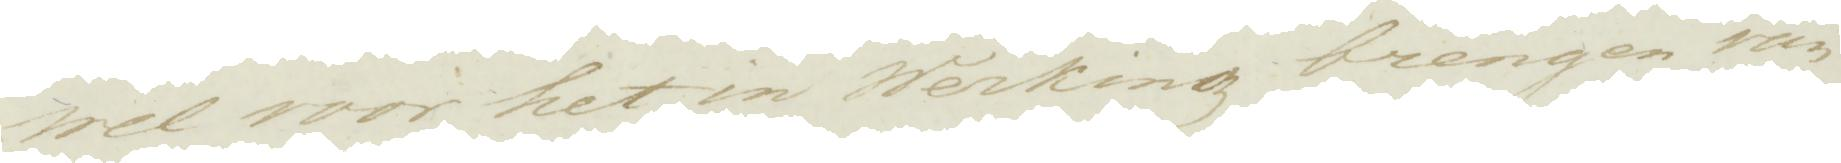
wel voor het in werking brengen van
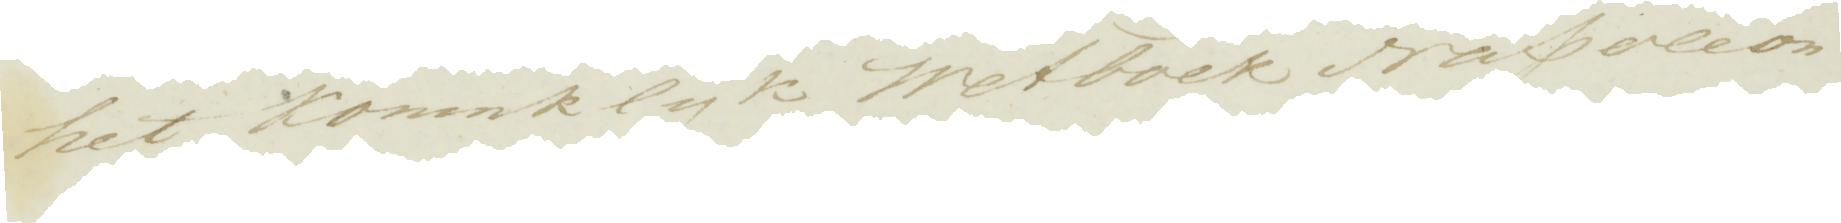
het Koninklyk wetboek Napoleon
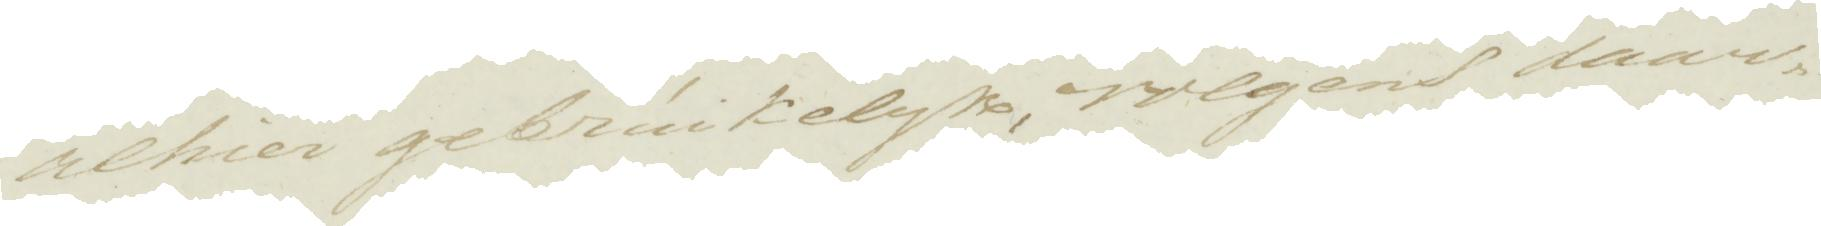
alhier gebruikelyk, volgens daar„
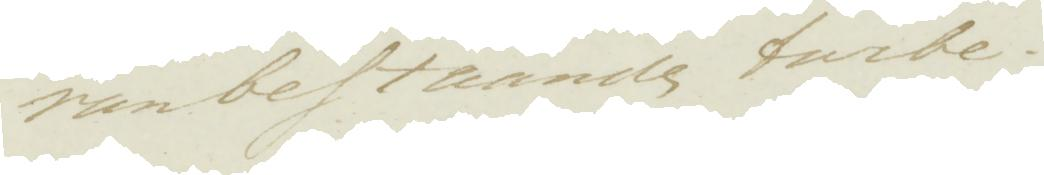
van bestaande turbe.
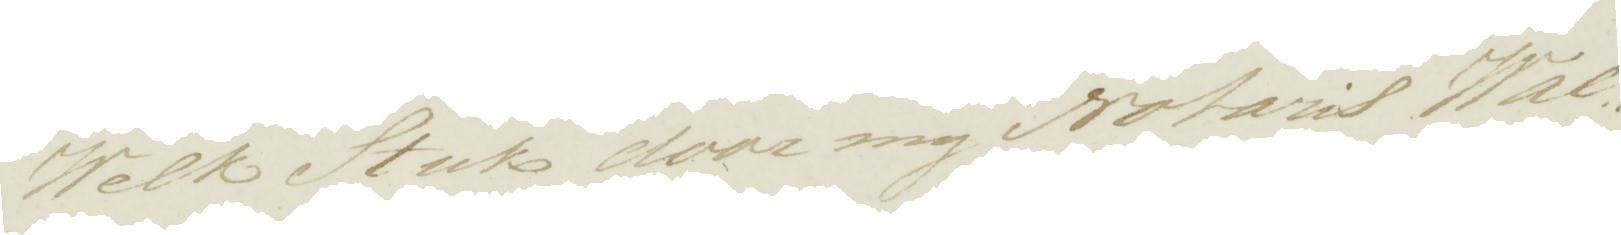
Welk stuk door my Notaris Wal
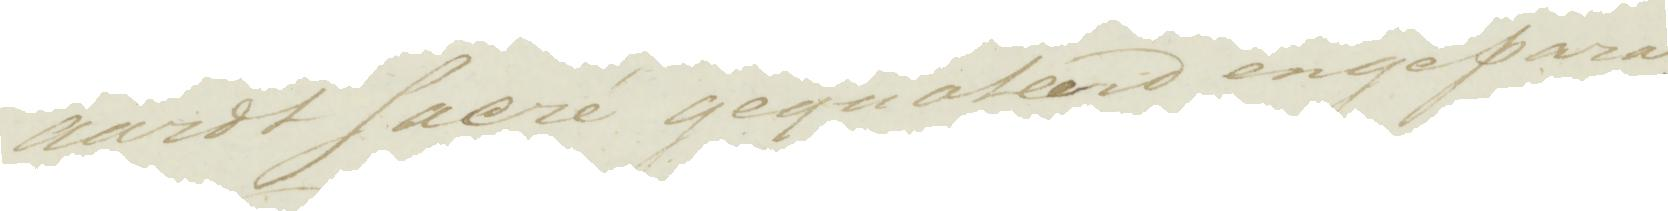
aardt Sacré gequoteerd en gepara
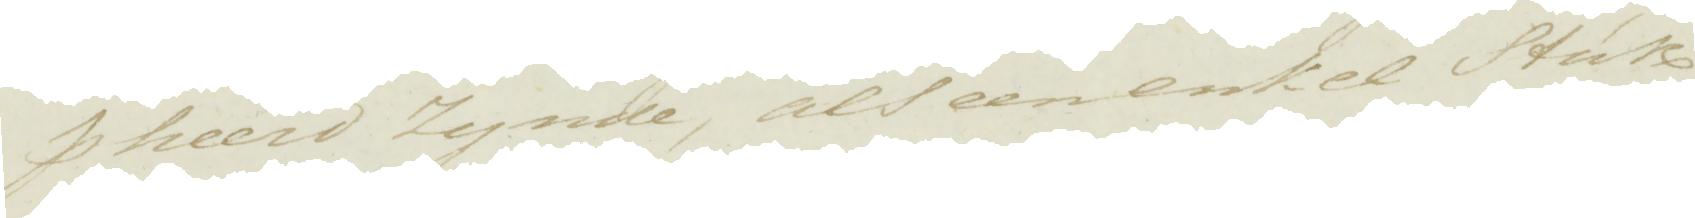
pheerd zynde, als een enkel stuk
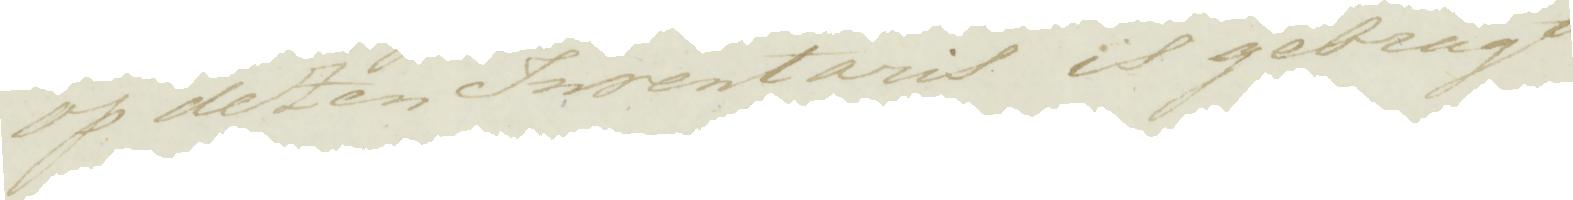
op dezen Inventaris is gebragt
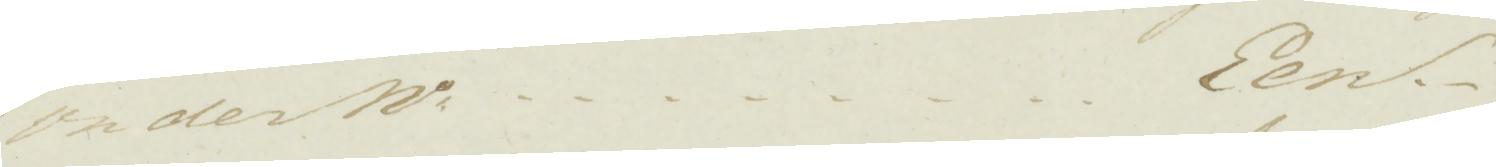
in der N„o - - - - - - . . Een. –
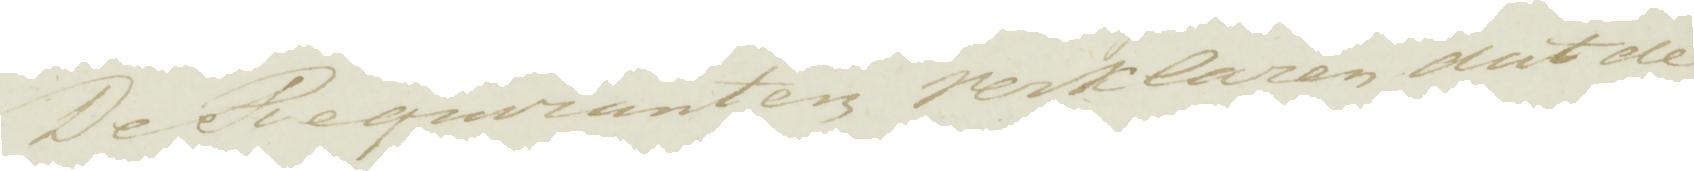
De Requiranten verklaren dat de
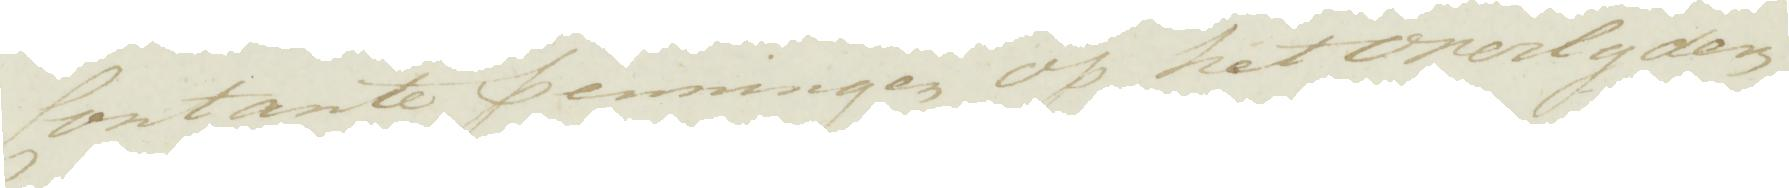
Contante penningen op het overlyden
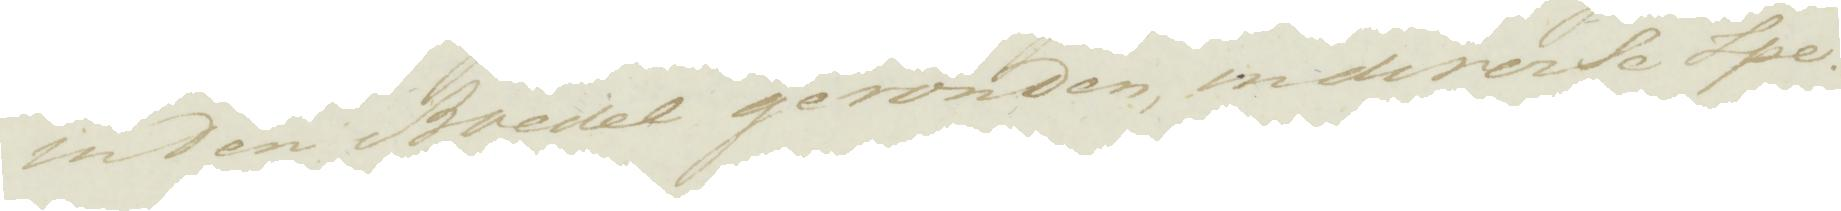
in den Boedel gevonden, in diverse spe
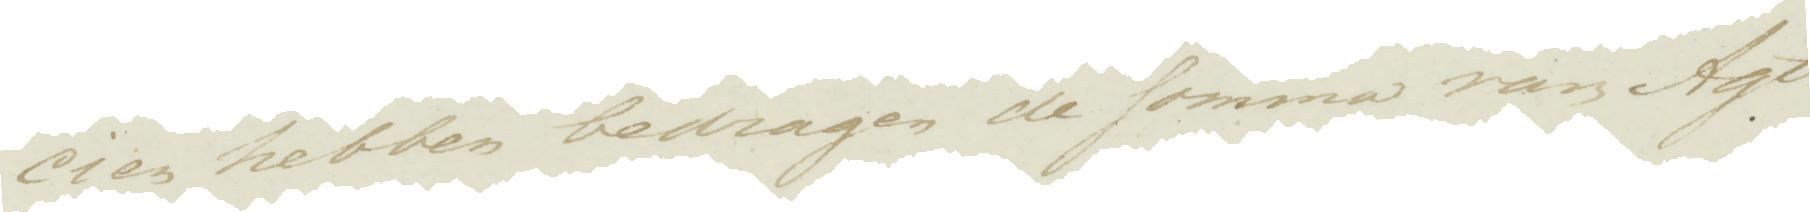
cien hebben bedragen de somma van Agt
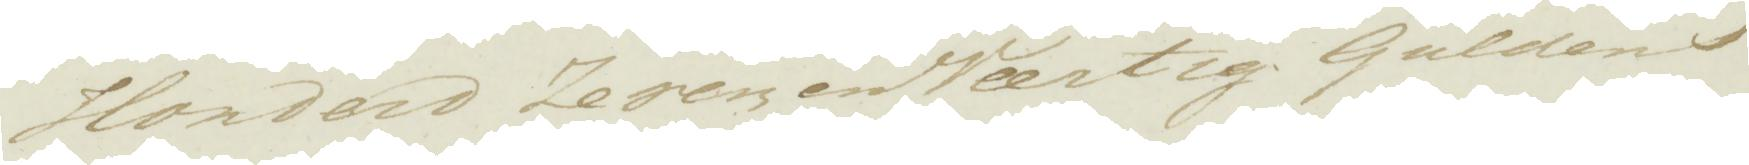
Honderd Zeven en Veertig Guldens
